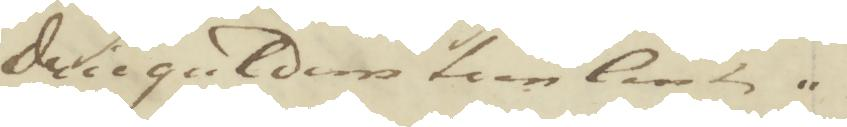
drie guldens tien Cents
